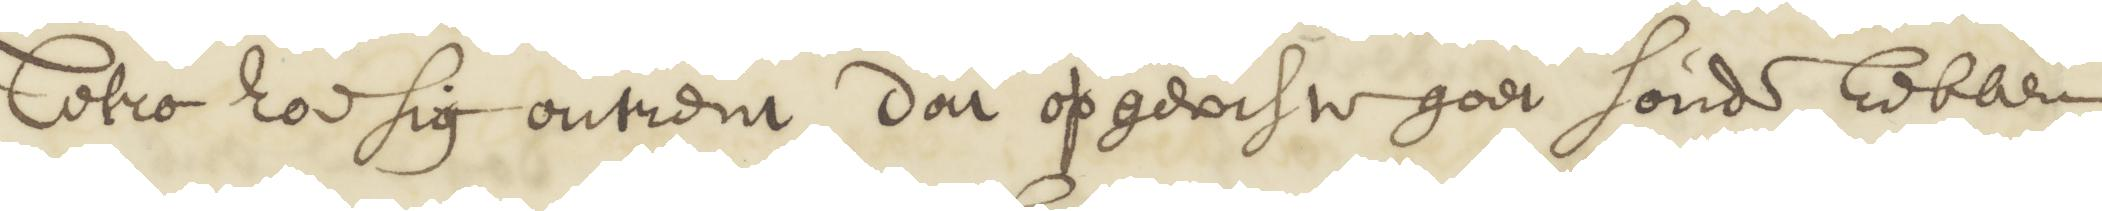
Teko hoe sig ontrent dat op geviste goet soude hebben
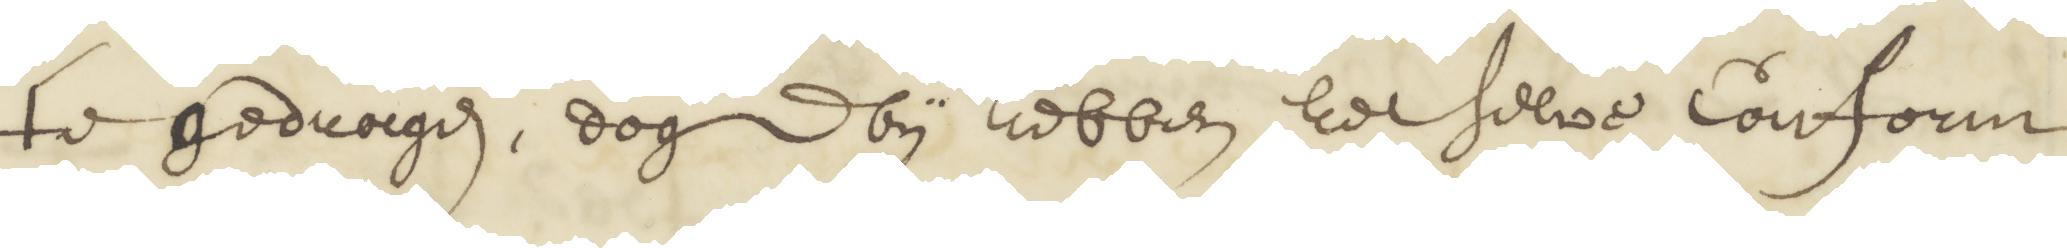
te gedragen, dog wij hebben het selve Conform
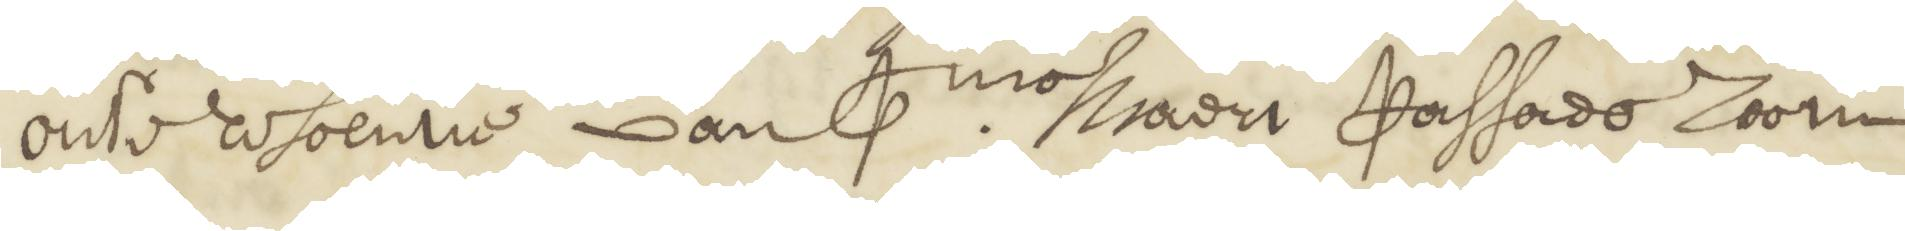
onse resolutie van p.mo maert passado zoo in
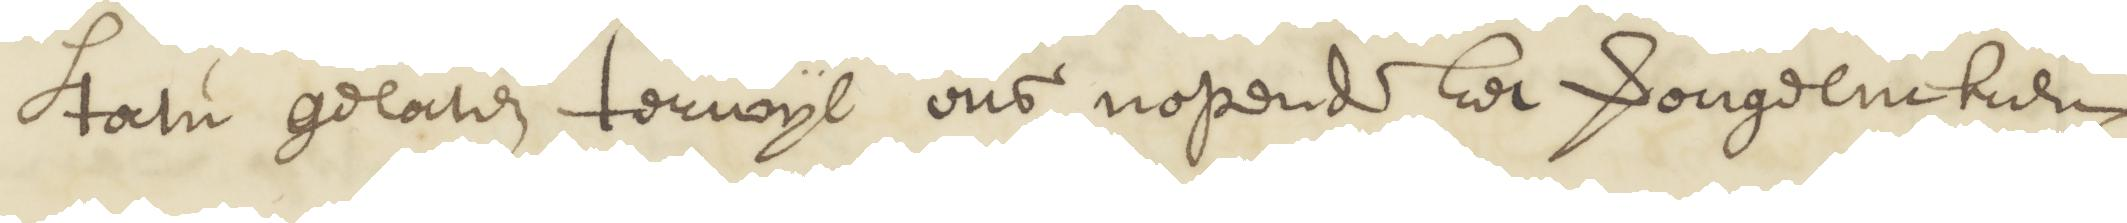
statu gelaten terwijl ons nopende het verongelucken
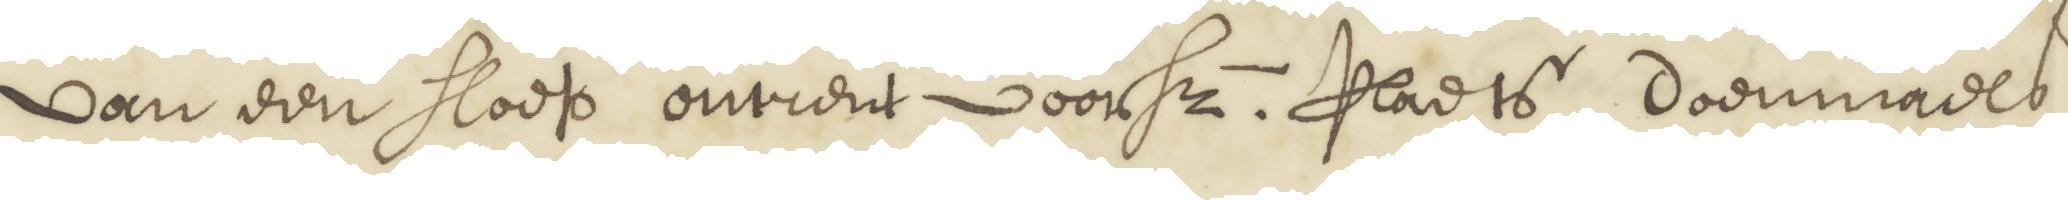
van een sloep ontrent voorsz. plaets doenmaels
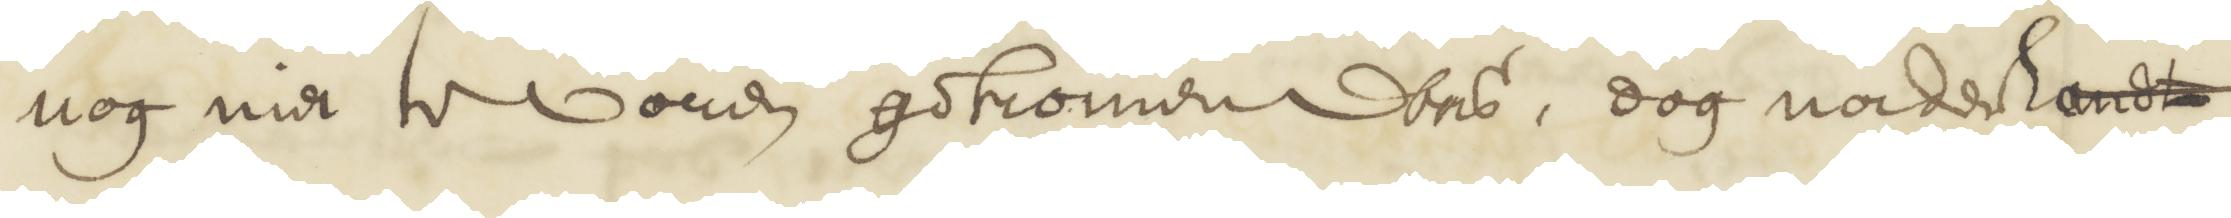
nog niet te voren gekomen was, dog naderhandt
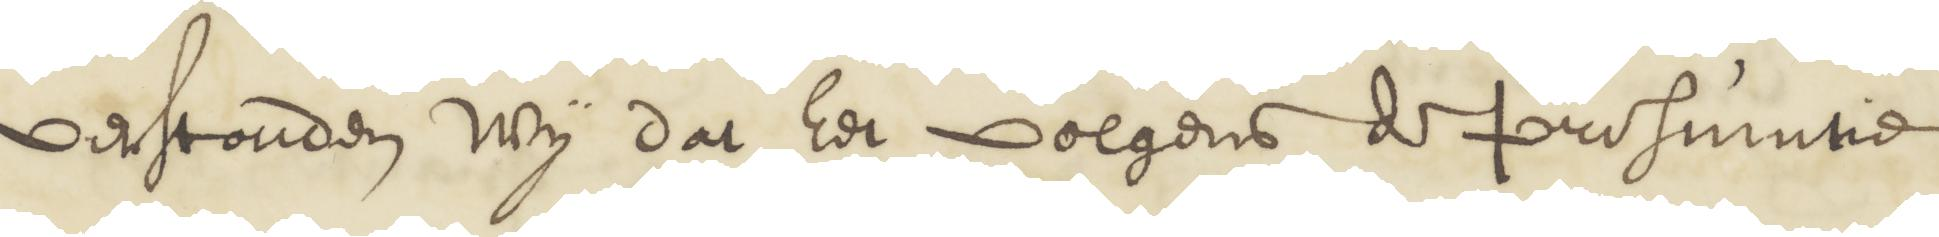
verstonden wij dat het volgens de presumtie
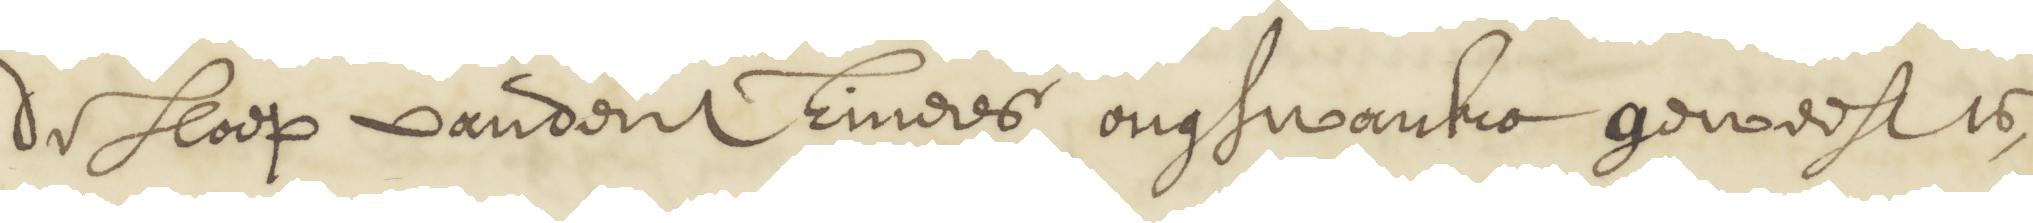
de sloep van den Chinees ongswanko geweest is,
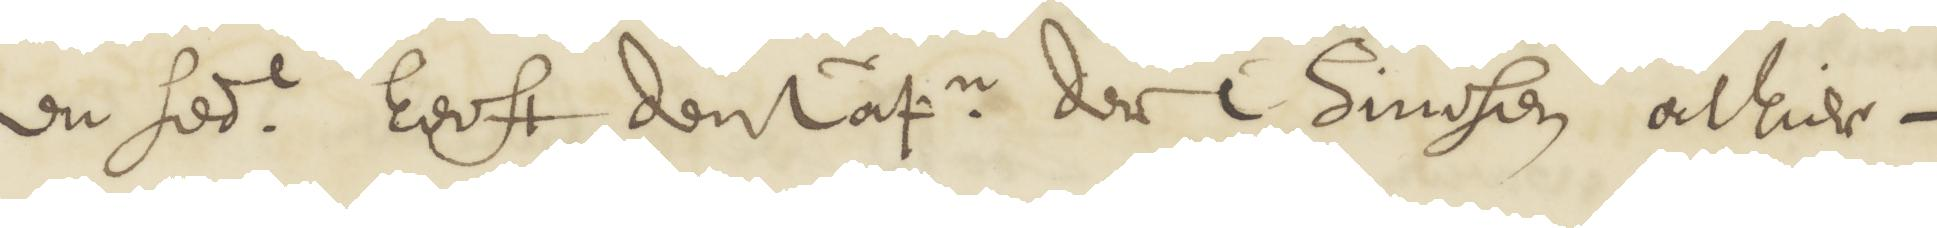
en sed.t heeft den Cap=n der Chinesen alhier
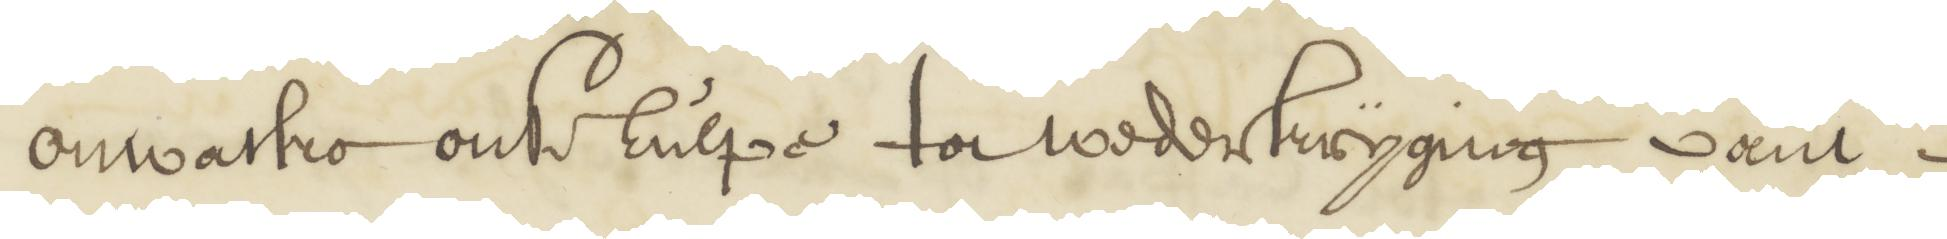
onwatko onse hulpe tot wederkrijging van't
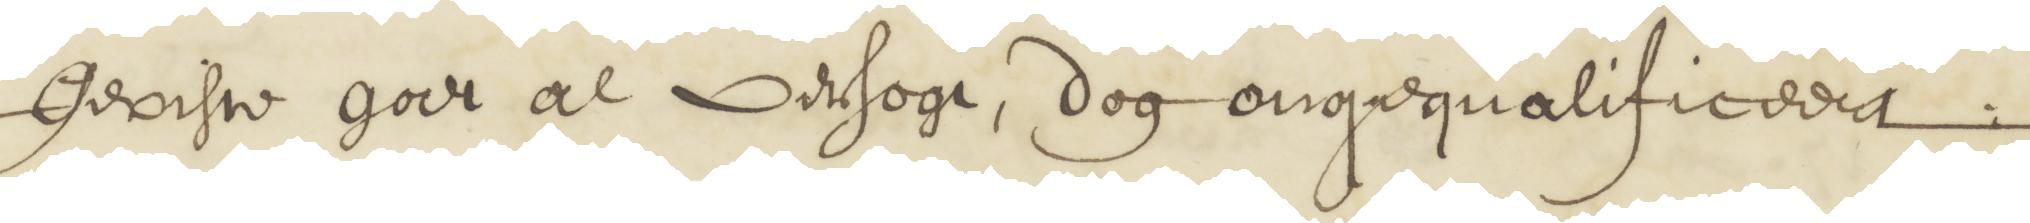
Geviste goet al versogt, dog ongequalificeert:
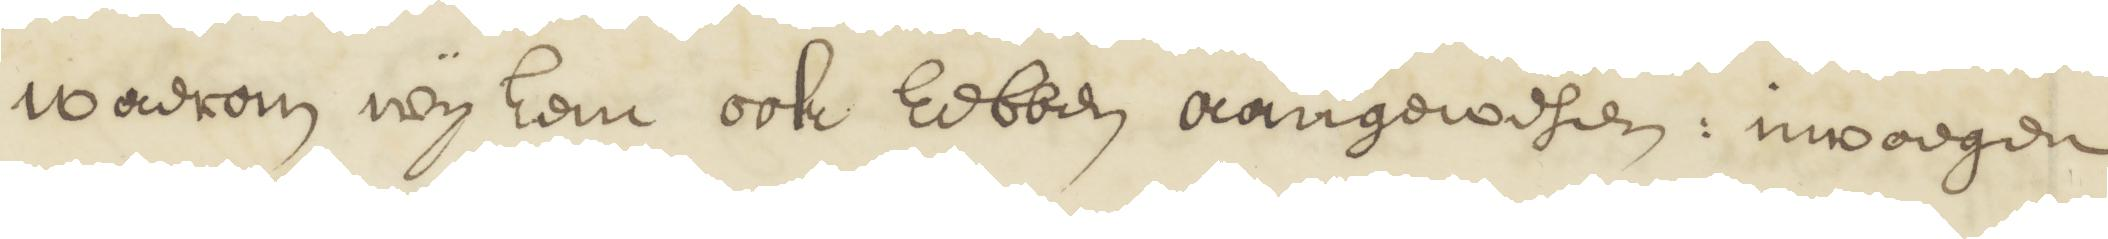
waerom wij hem ook hebben aangewesen: invoegen
